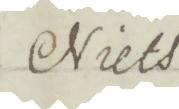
Niets
